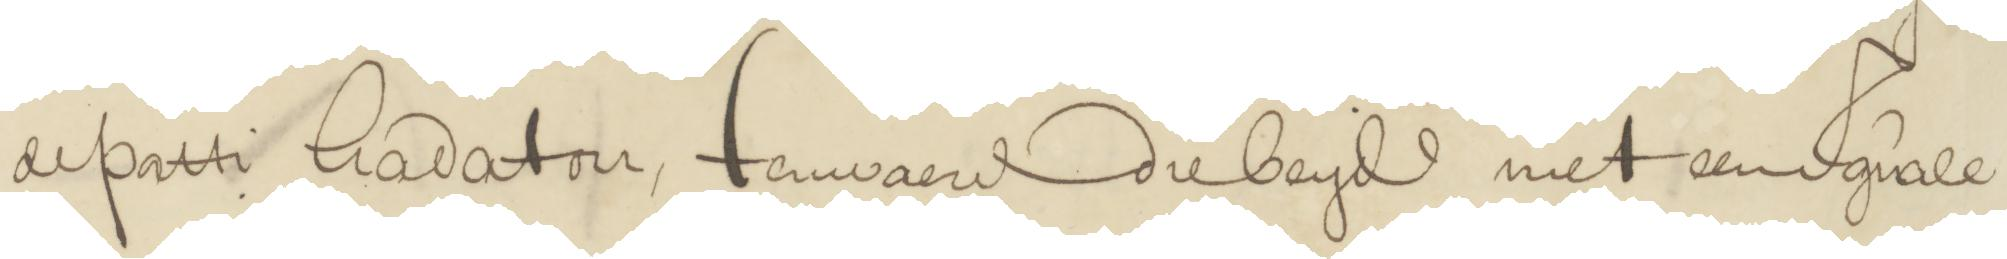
depatti kadaton, tenwaere die beijde met een Eguale
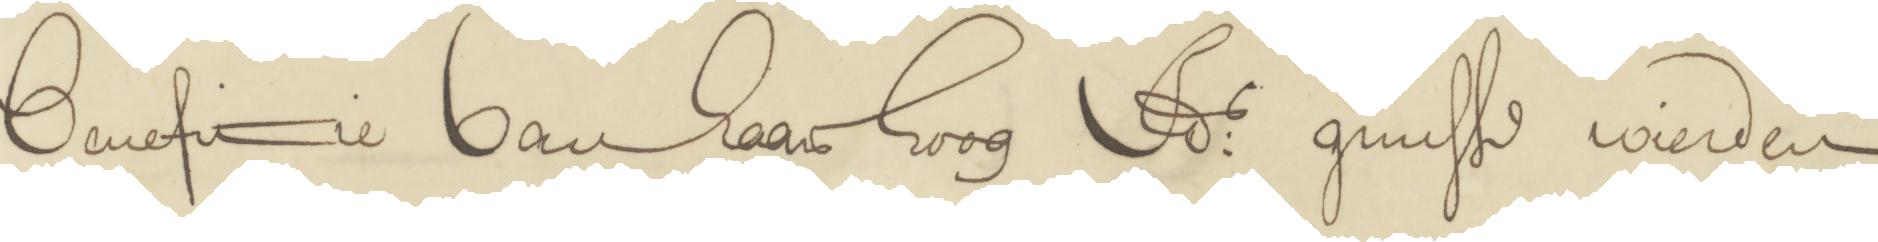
beneficie van haar hoog Ed:s gunste wierden
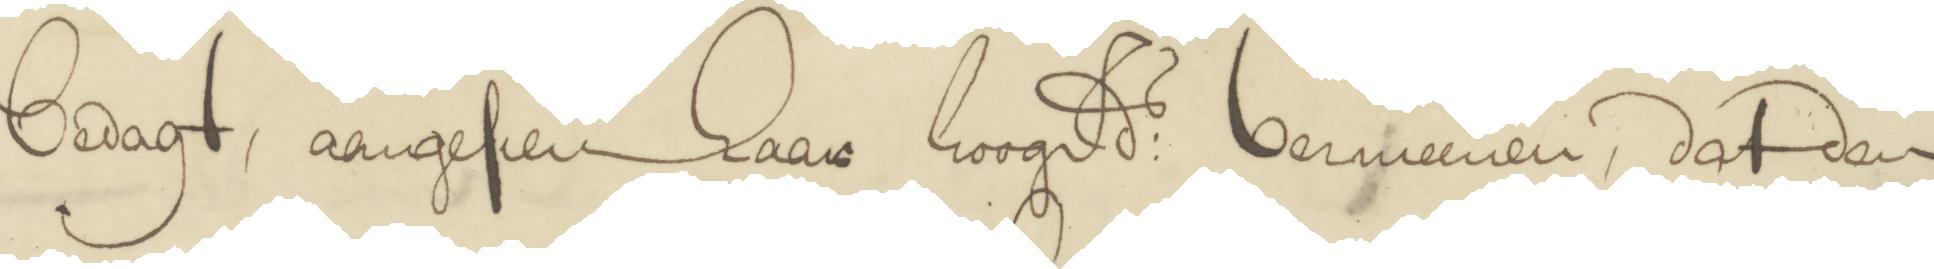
bedagt, aangesien haar hoog Ed:s vermeenen, dat den
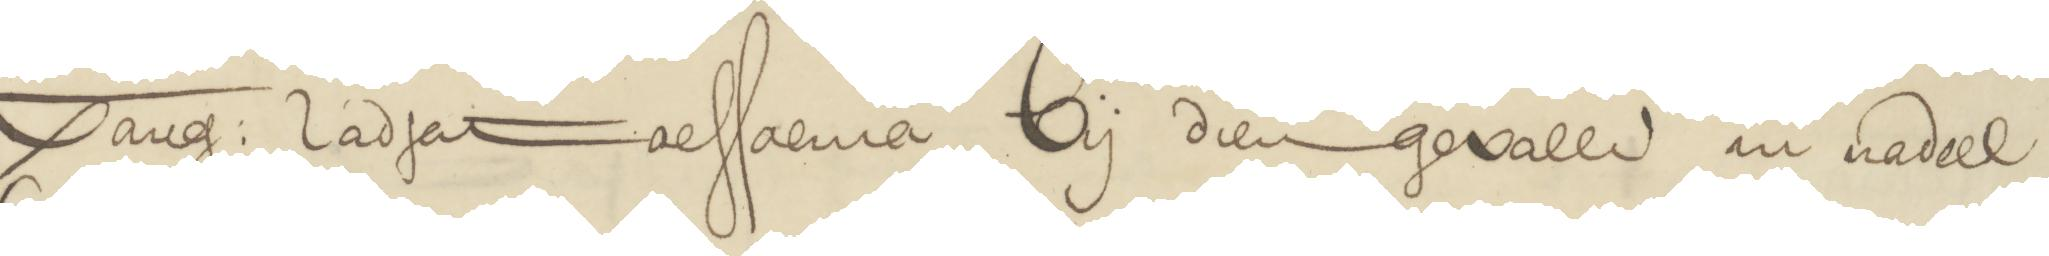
pang: radja coessoema bij dien gevalle in nadeel
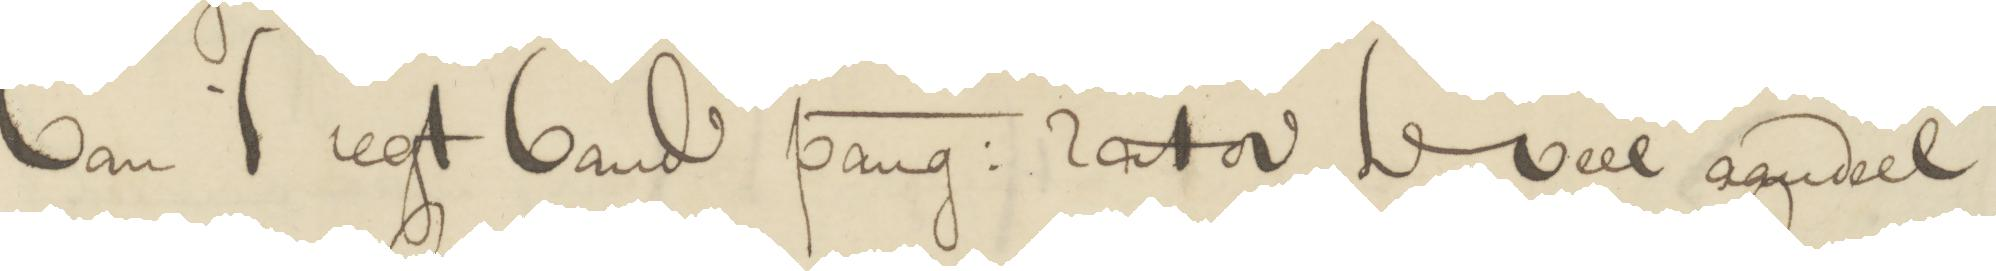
van ’t regt vande pang: ratoe te veel aandeel
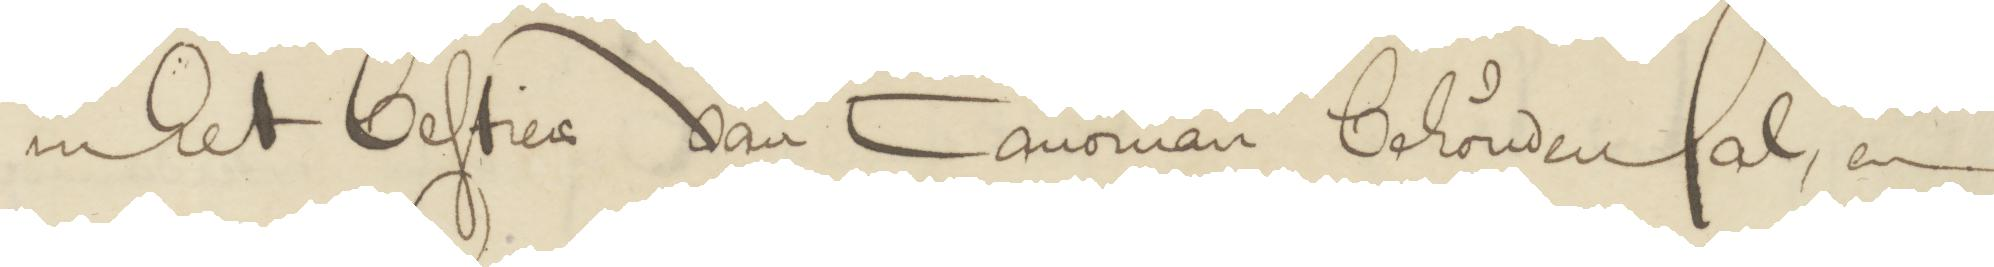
in het bestier van Canoman behouden sal, en
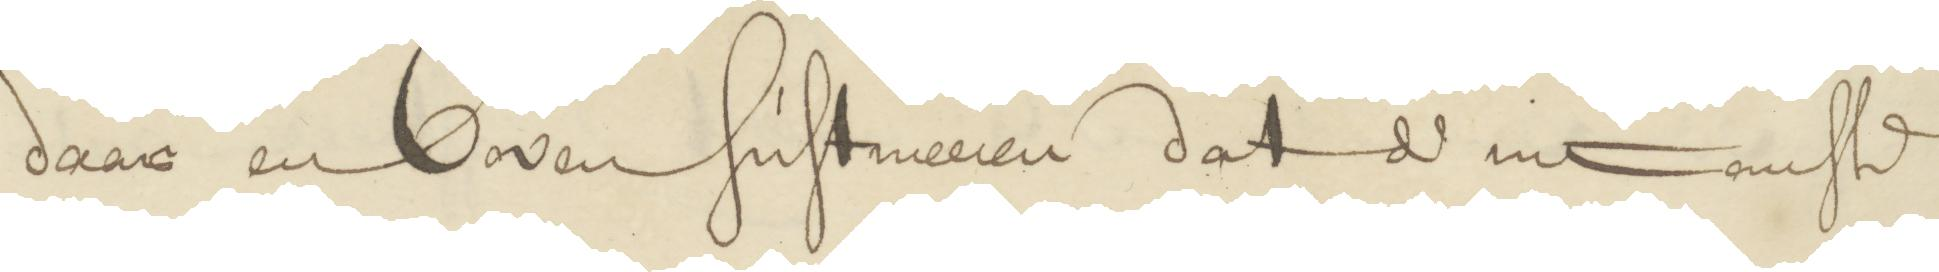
daar en boven sustineeren dat de incomste
